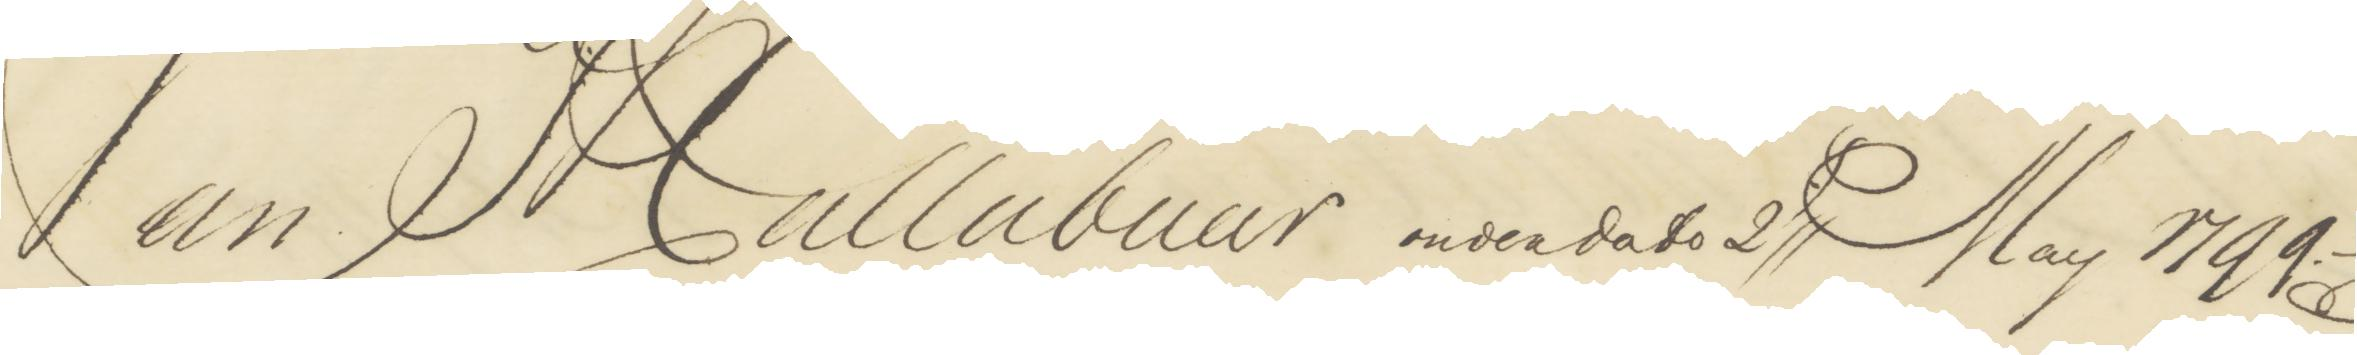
Van Mallabaar onder dato 2„' Maij 1744:
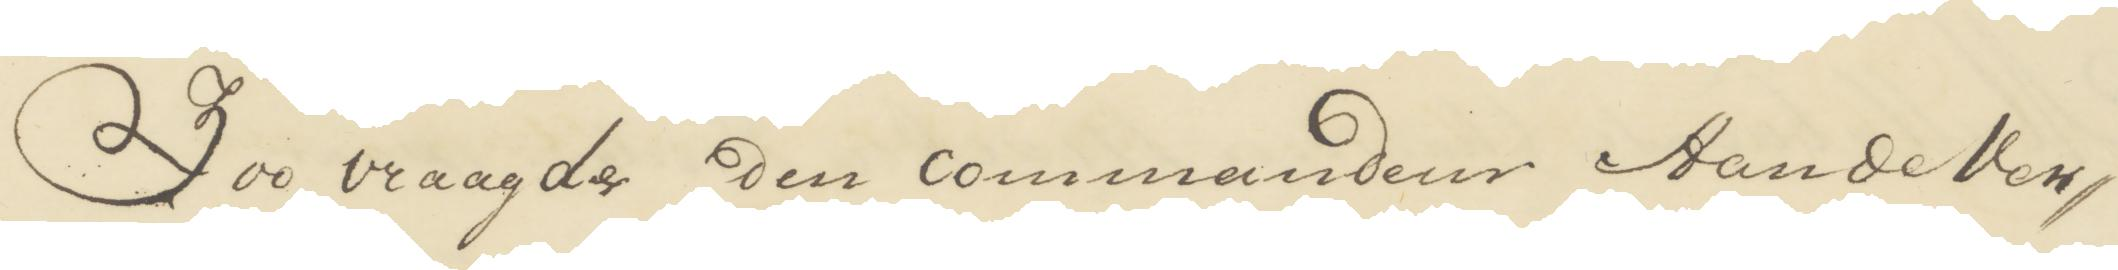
Zoo vraagde den commandeur Aan de ver„
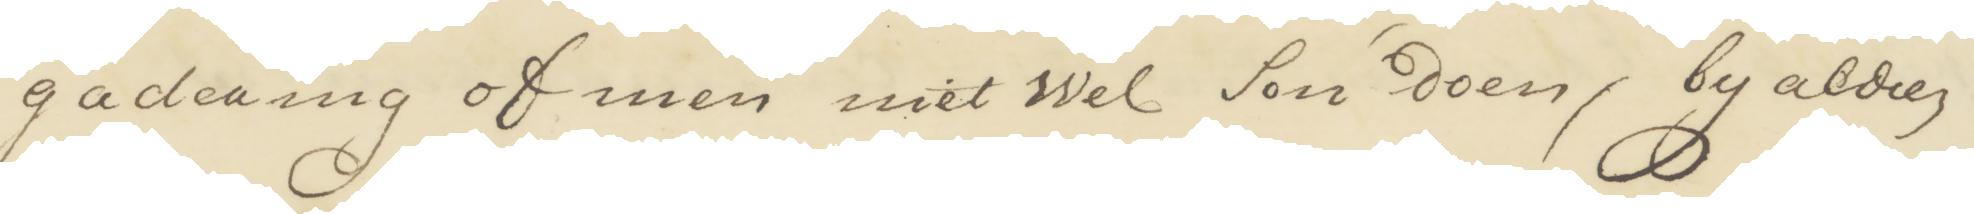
gadering of men niet wel sou doen, by aldien
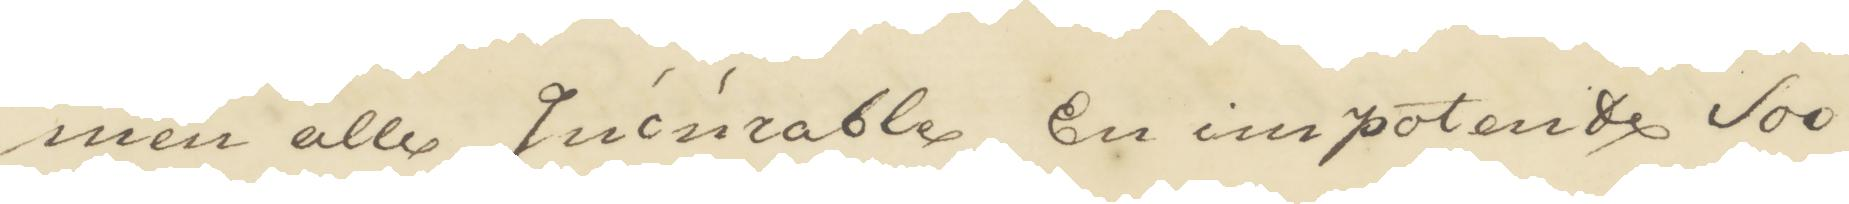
men alle Jncurable en impotente soo
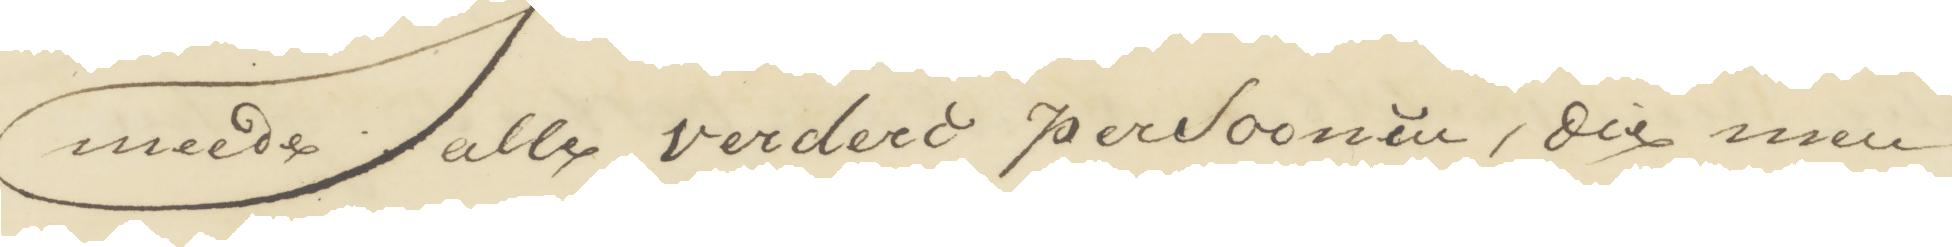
meede alle verdere persoonen, die men
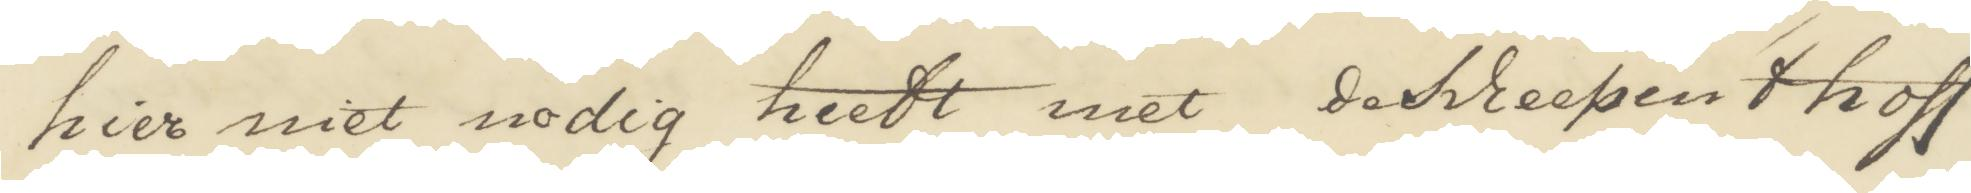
hier niet nodig heeft met descheepen 't hoff
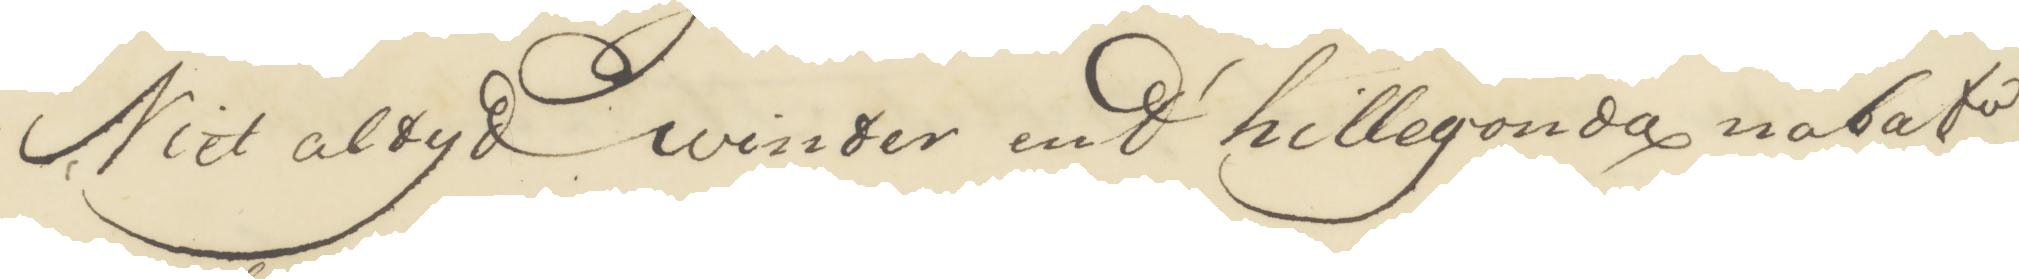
Niet altyd winter en d’ hillegonda nabat.a
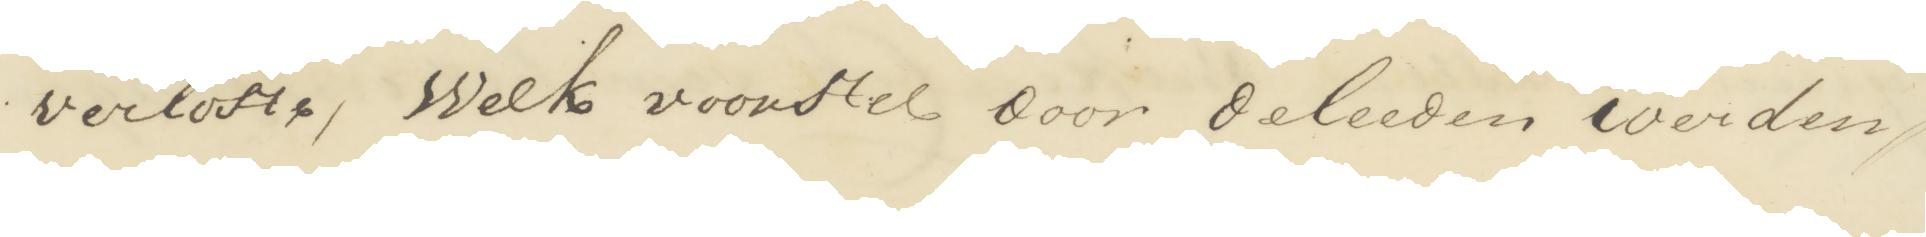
verloste, welk voorstel door deleeden werden„
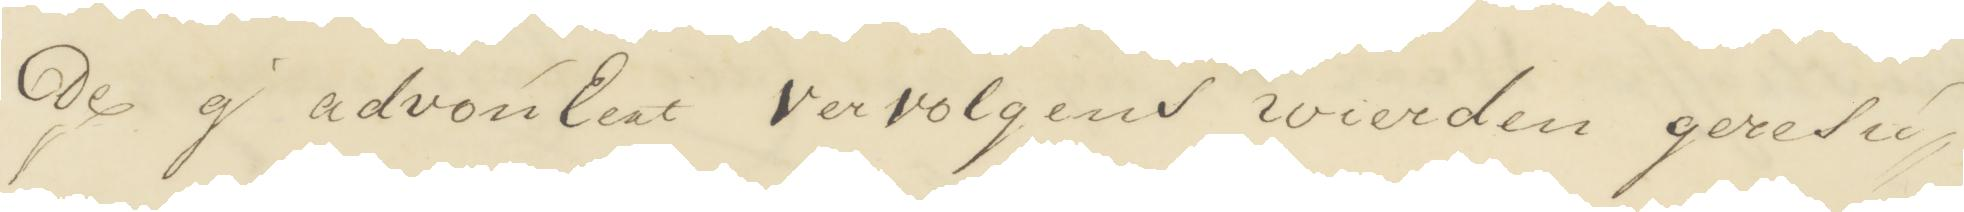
de g’advouheert vervolgens wierden geresu„
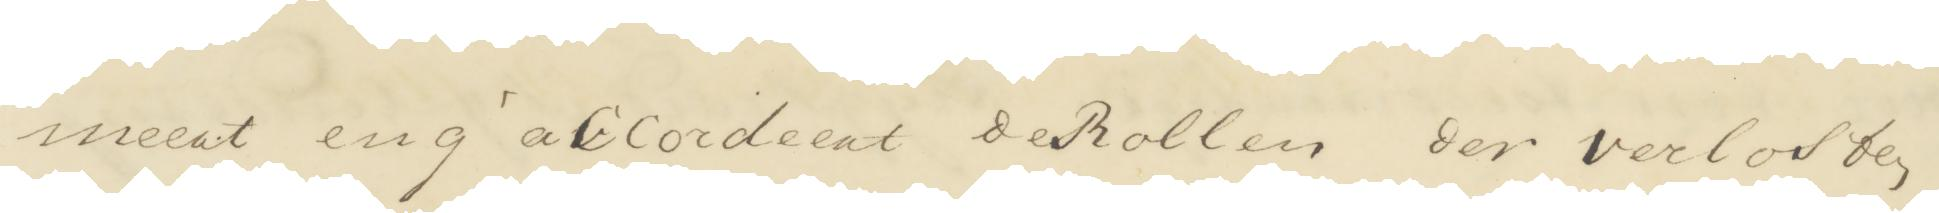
meert en g’ accordeert de Rollen der verlosten
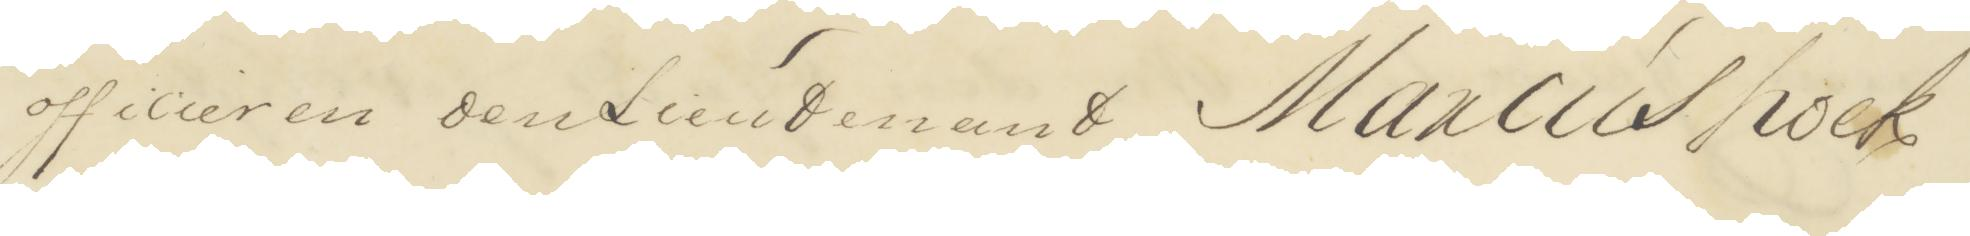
officieren den Lieutenant Marcus hoek
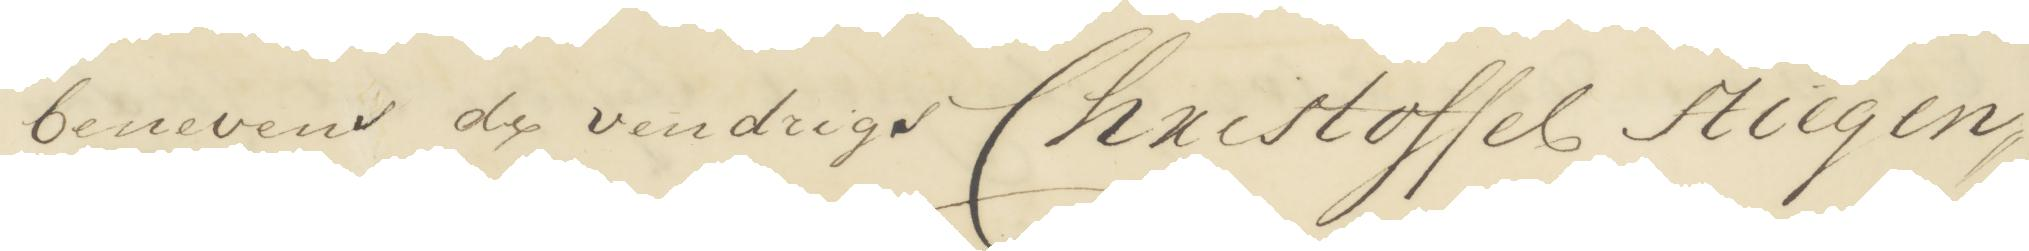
benevens de vendrigs Christoffel Stiegen„
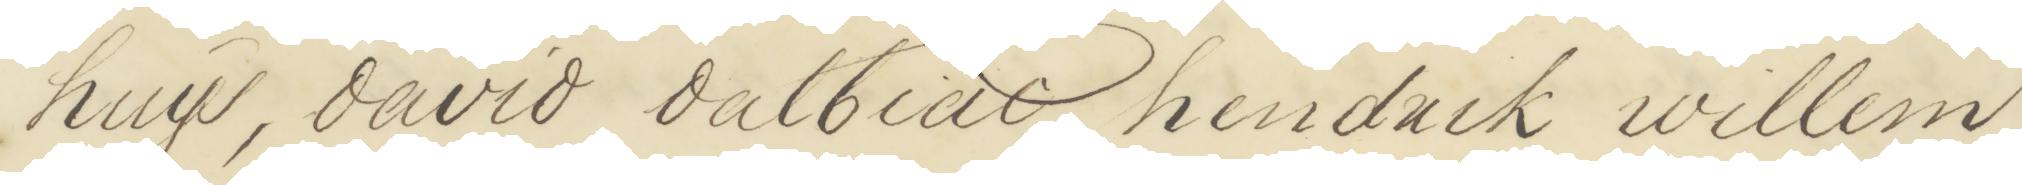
huijs, david dalbiac, hendrik willem
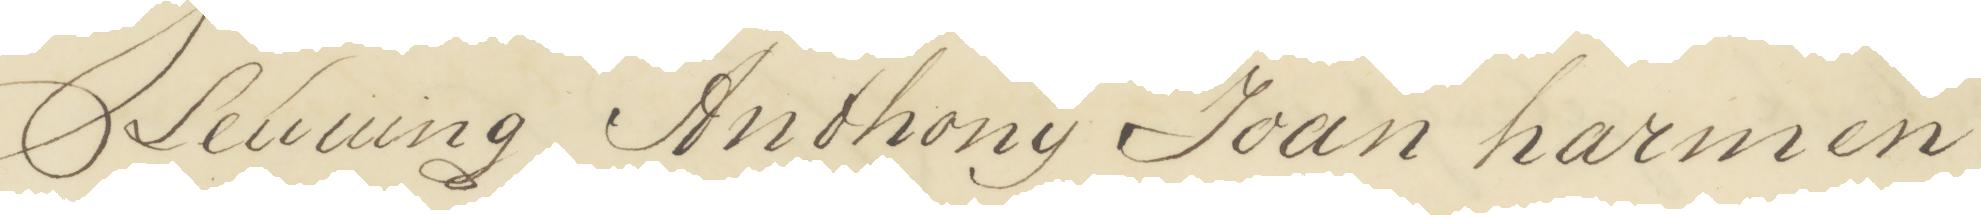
Leuning Anthonij Joan harmen
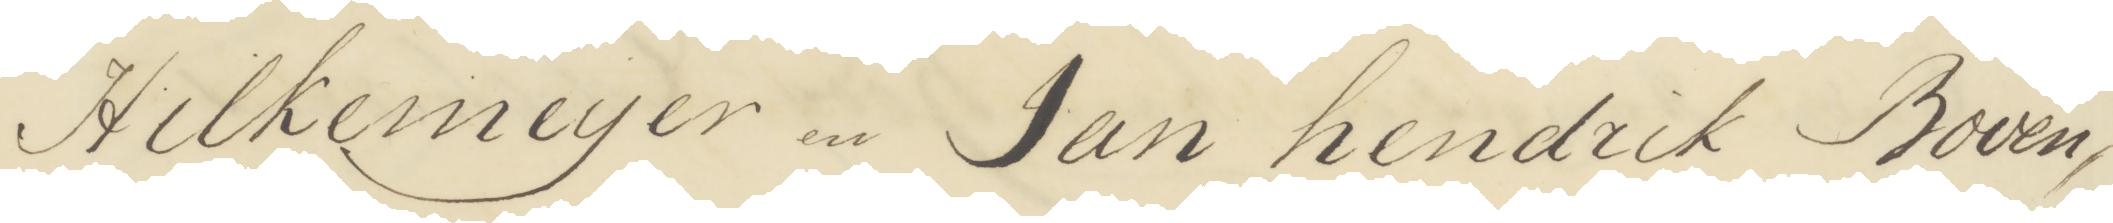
Hilkemeyer en Jan hendrik Boven„
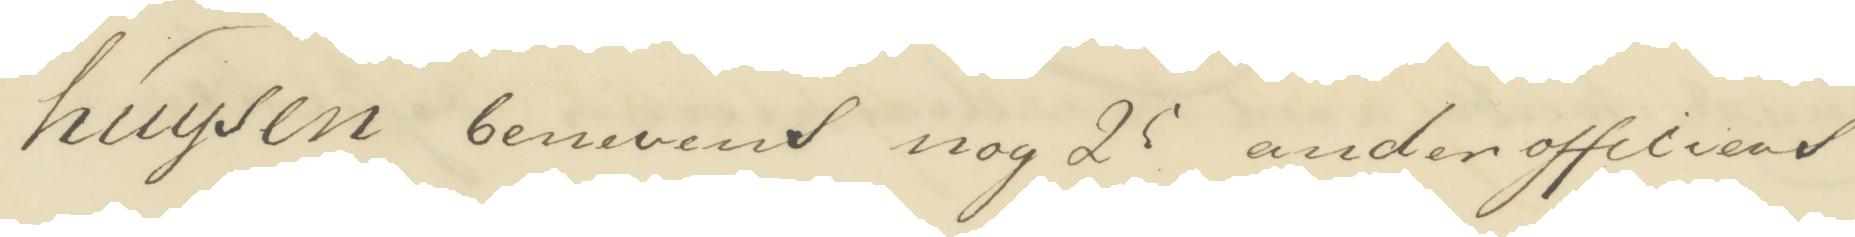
huijsen benevens nog 25 ander officiers
